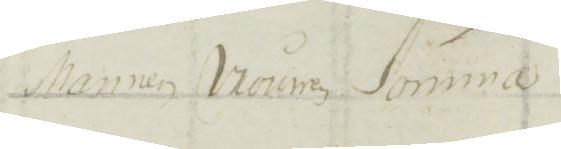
Mannen Vrouwen Somma
